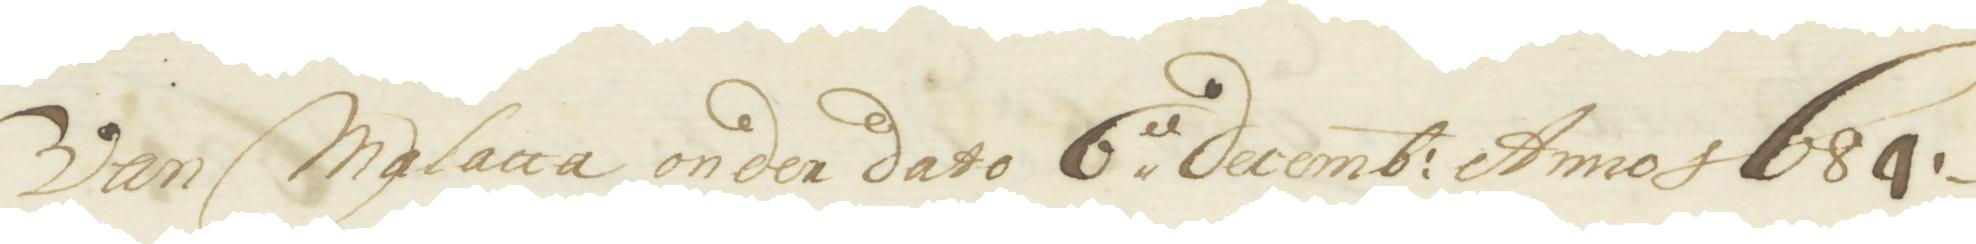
Van Malacca onder dato 6„e decemb: Anno 1684._
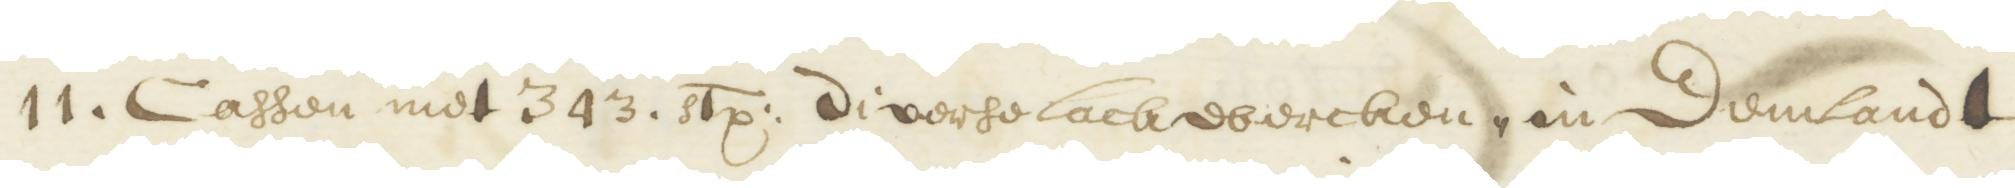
11. Cassen met 343. stx: diverse lack wercken, in Eemlandt
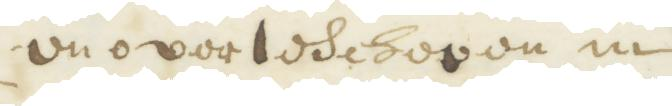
en over te schepen in
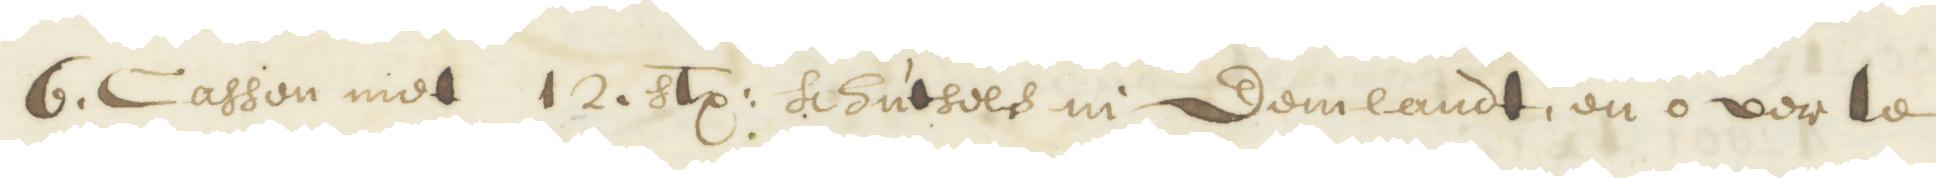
6. Cassen met 12. stx: schutsels in Eemlandt, en over te
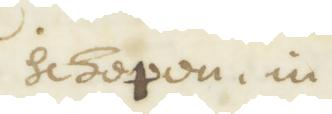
schepen, in
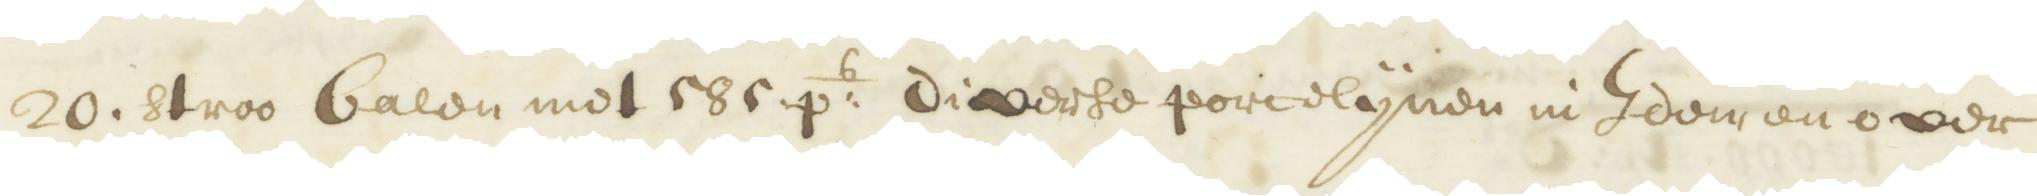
20. stroo balen met 585 p:s diverse porcelijnen in Jder, en over
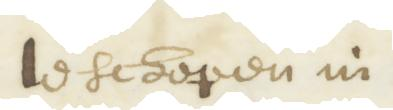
te schepen in
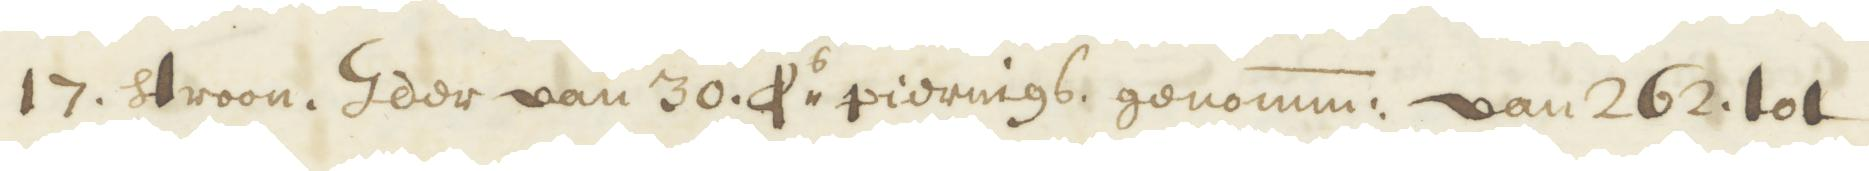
17. stroon. Jder van 30. p„s pierings. genomm: van 262. tot
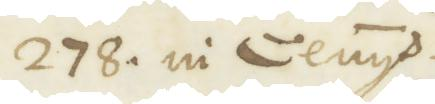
278. in Cluys —
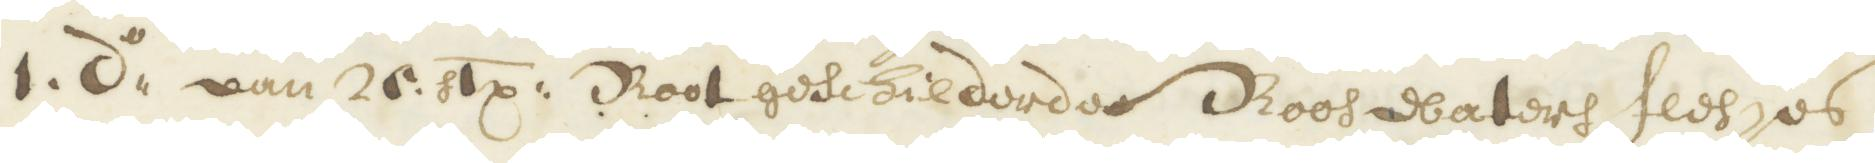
1. d„o van 25. stx: Root geschilderde Roos waters flesjes
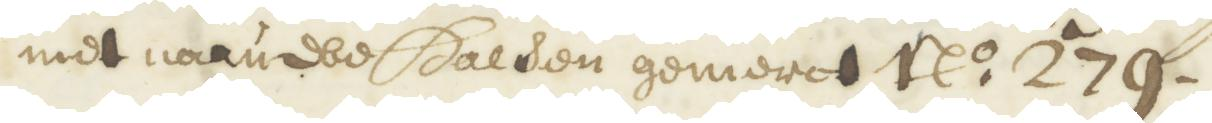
met naauwe halsen gemerct N„o 279.
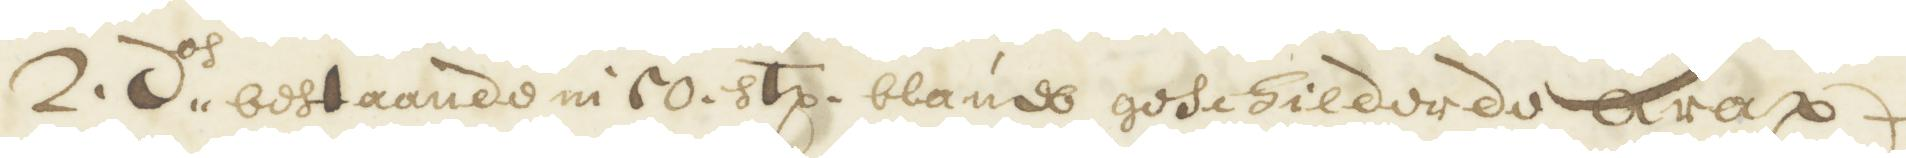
2. d„os bestaande in 50. stx. blauw geschilderde arax -
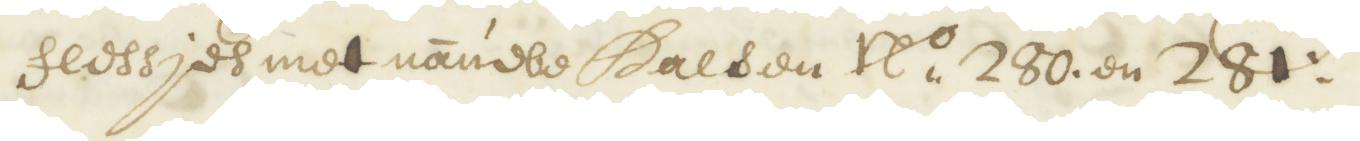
flessjes met nauwe halsen N„o 280. en 281:
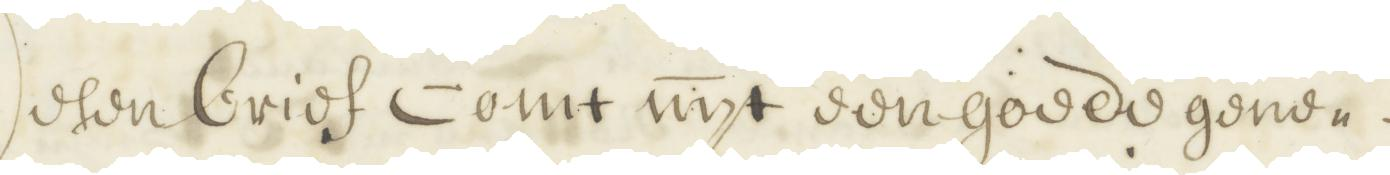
esen brief comt uyt een goede gene„
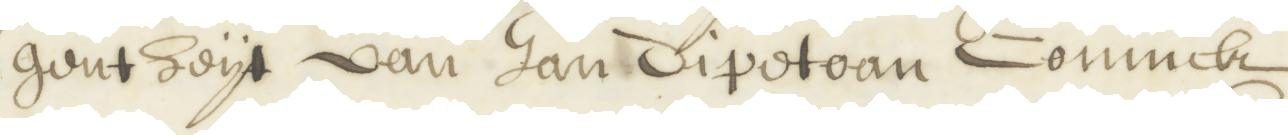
gentheijt van Jan dipetoan Coninck
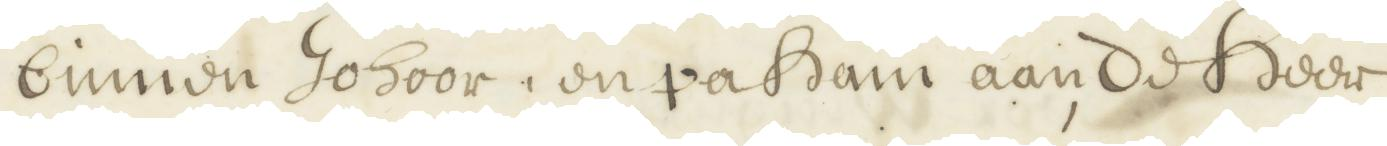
binnen Johoor, en paham aan de Heer
